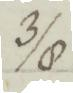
3/8
